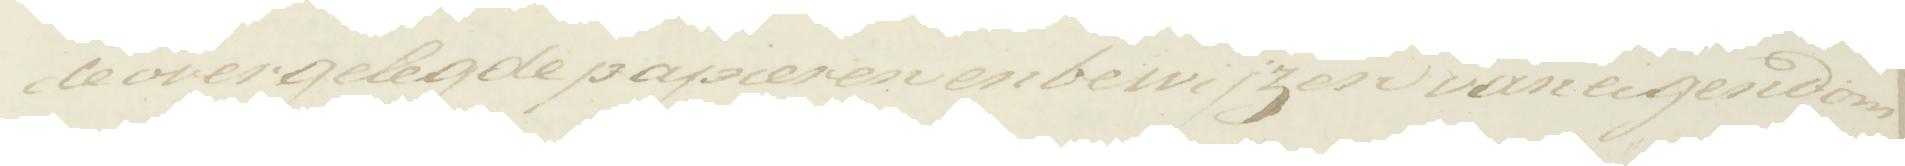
de overgelegde papieren en bewijzen van eigendom
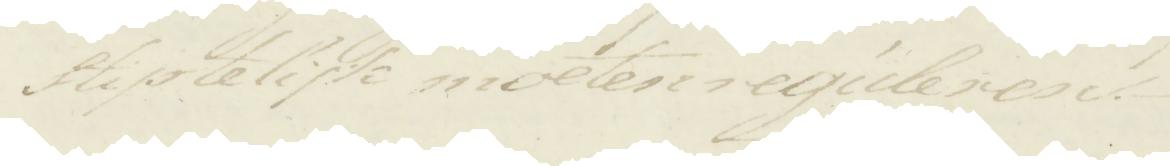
stiptelijk moeten reguleren.
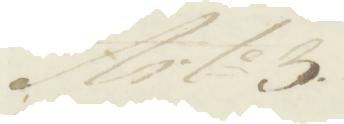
Art= 3.
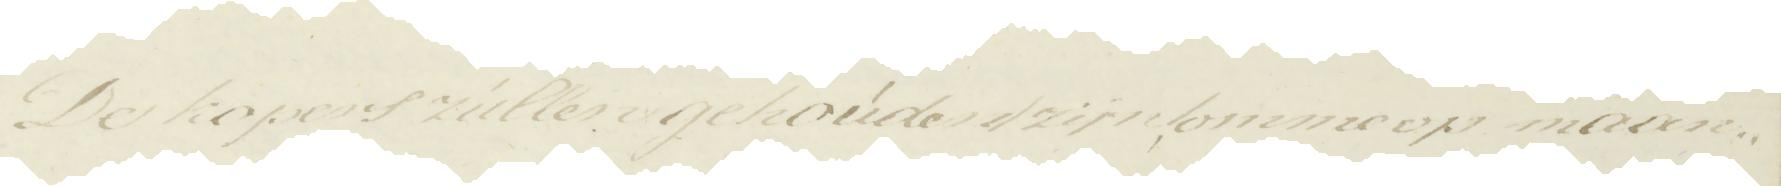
De kopers zullen gehouden zijn, omme op maan„
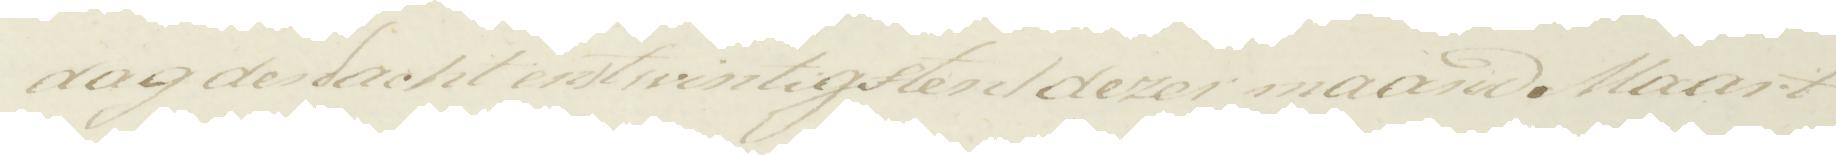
dag den acht entwintigsten dezer maand Maart
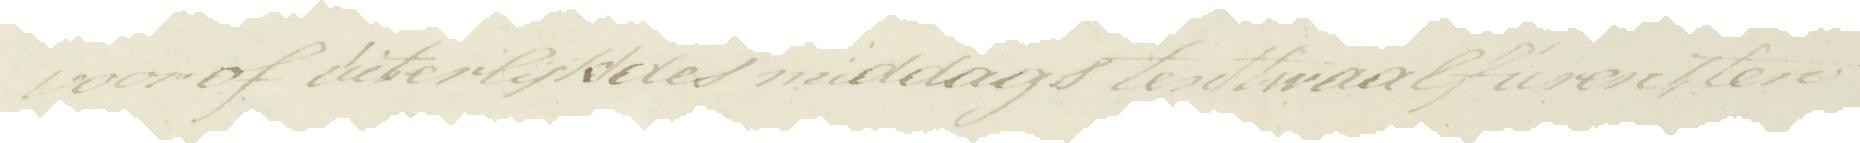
voor of uiterlijk des middags ten twaalf uren ten
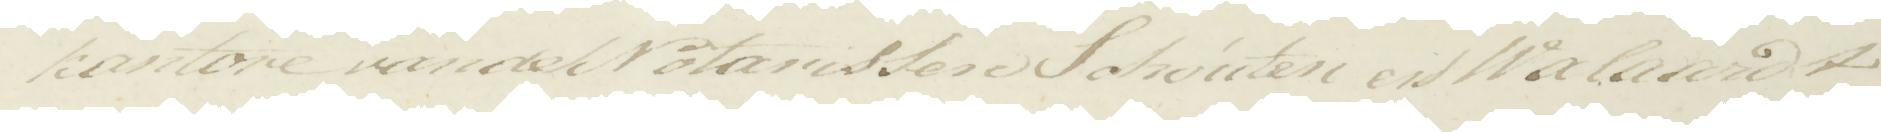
kantore van de Notarissen Schouten en Walaardt
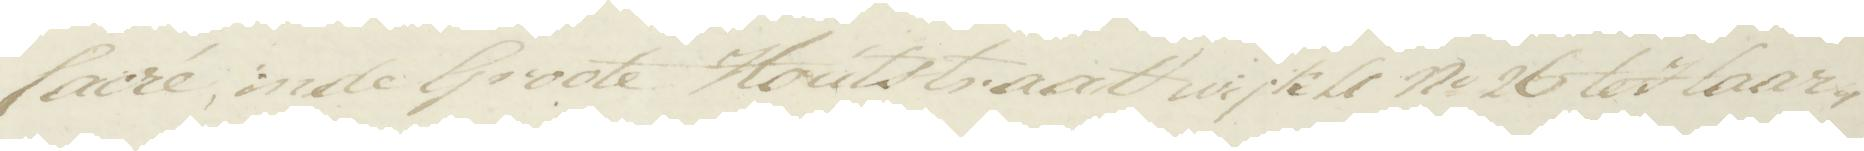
Sacré, in de Groote Houtstraat wijk 4 no 26 te Haar„
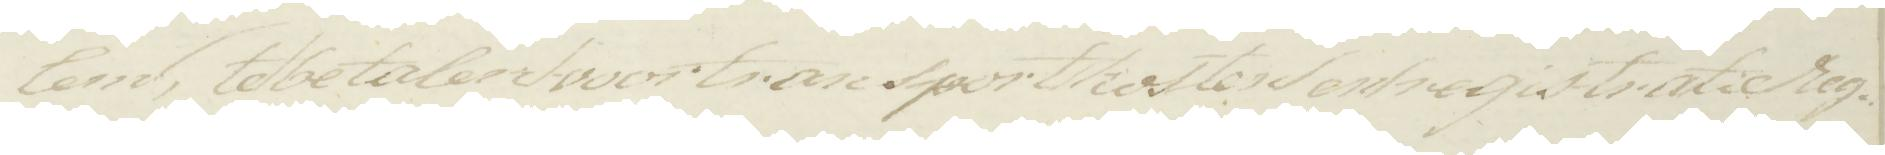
lem, te betalen voor transportkosten en registratie reg„
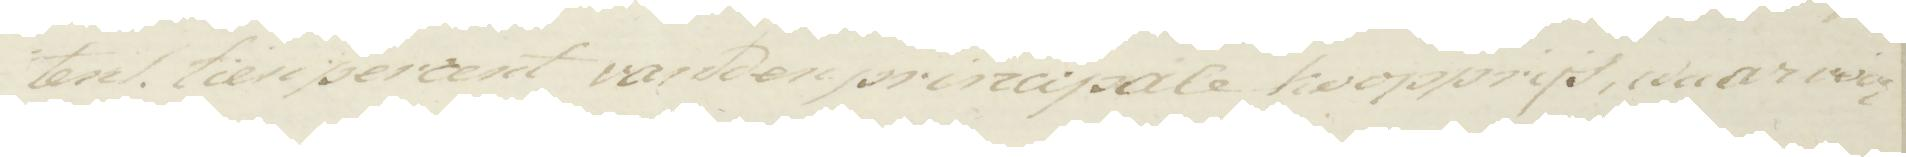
ten tien percent van den principale koopprijs, waar nog
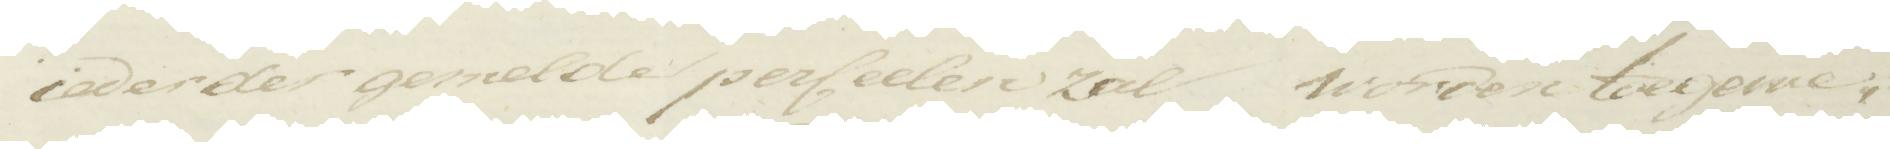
ieder der gemelde perceelen zal worden toegewe„
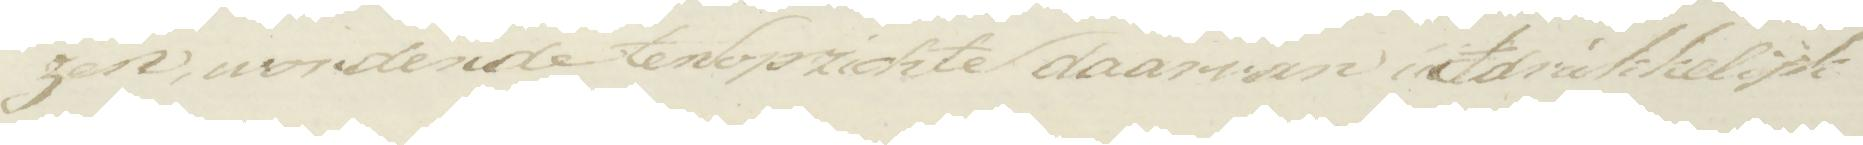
zen, wordende ten opzichte daarvan uitdrukkelijk
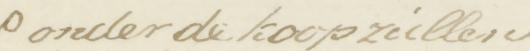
¶ onder de koop zullen
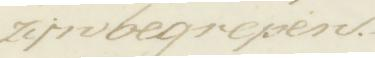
zijn begrepen.
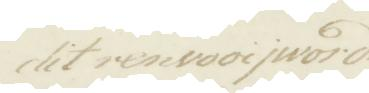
dit renvooij word
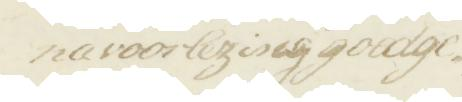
na voorlezing goedge
